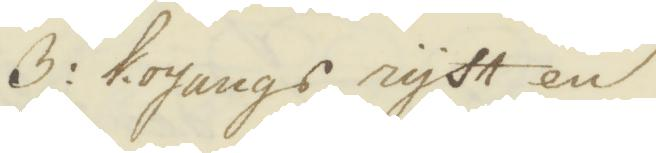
3: kojangs rijst en
